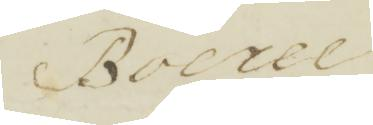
Boeree
